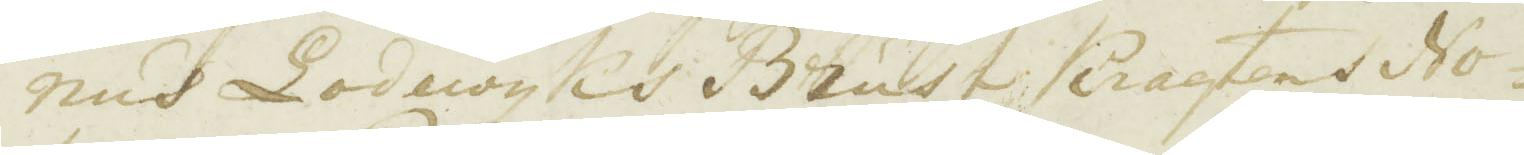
nus Lodewyks Brust: Kragtens No„
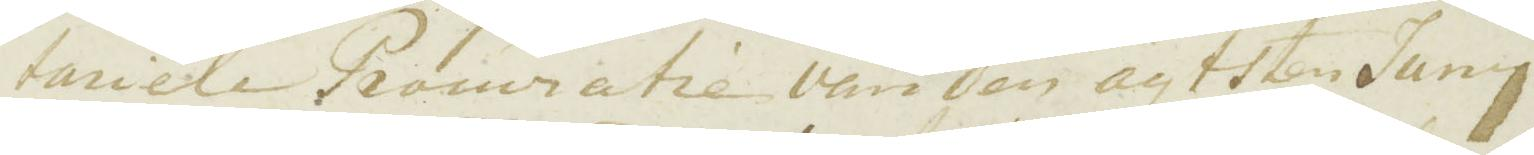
tariële Procuratie van den agtsten Iuny
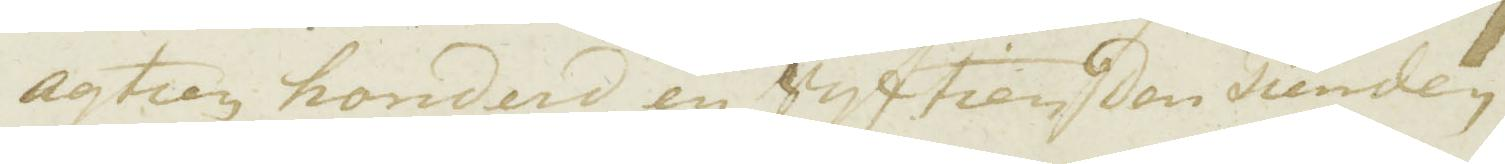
agtien honderd en vyftien den Tienden
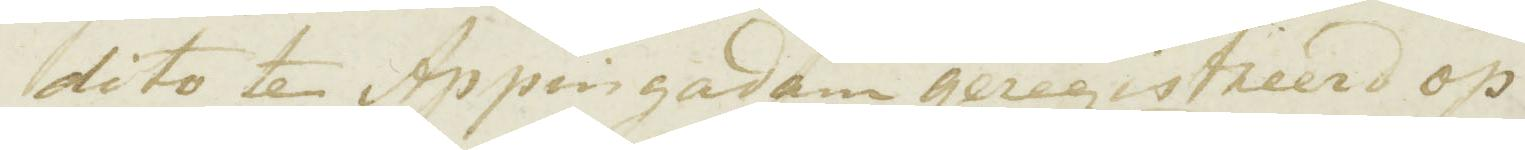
dito te Appingadam geregistreerd op
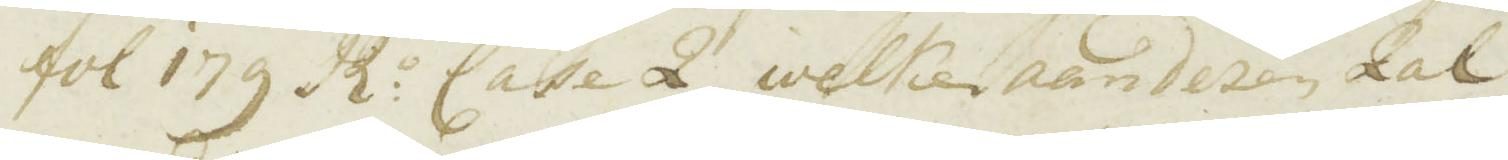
fol 179 R:o Case 2: welke aan dezen Zal
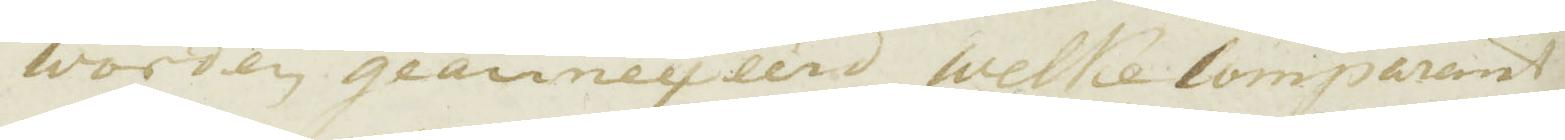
worden geannexeerd welke comparant
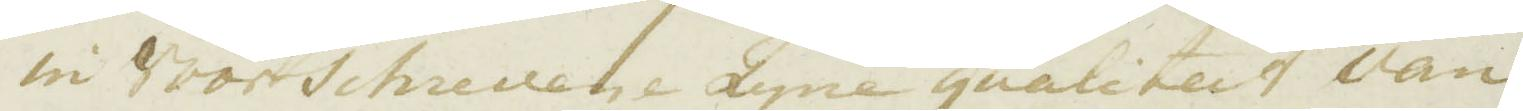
in voorschrevene Zyne qualiteit van
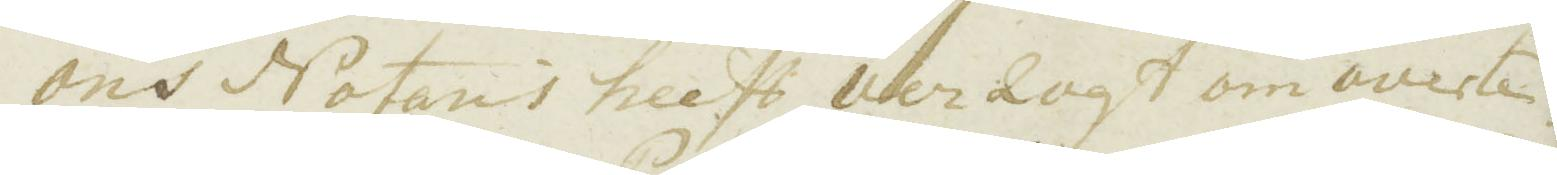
ons Notaris heeft verzogt om overte„
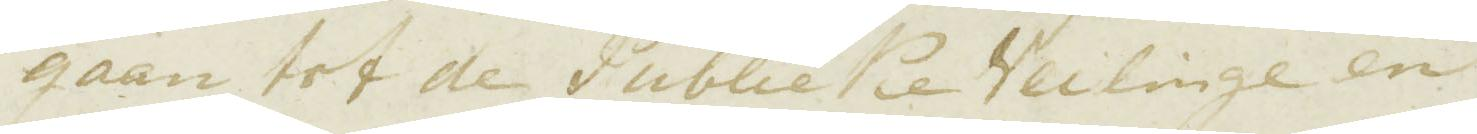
gaan tot de Publieke Veilinge en
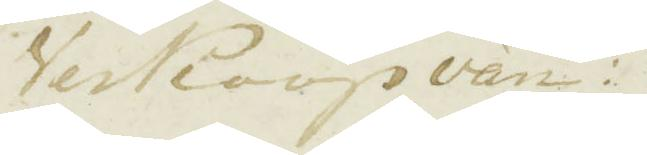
Verkoop van:
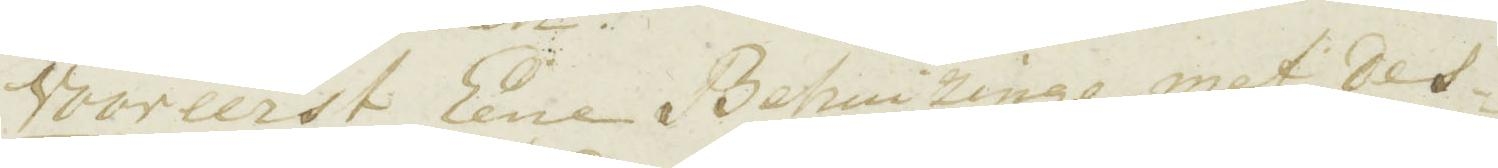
Voor eerst Eene Behuizinge met des
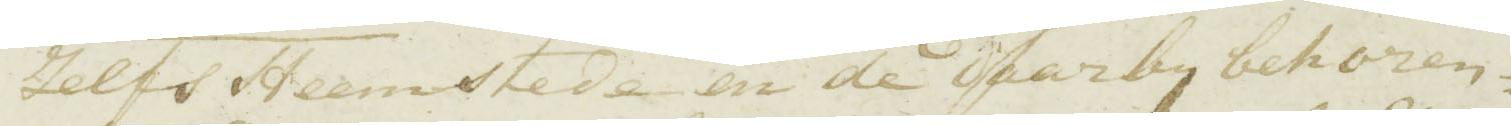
zelfs Heemstede en de daarby behoren„
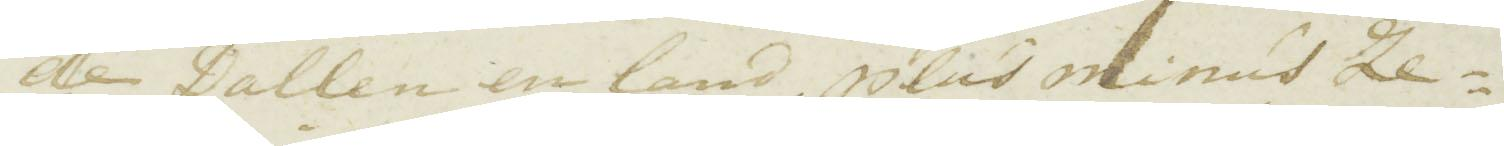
de Dallen en land plus minus Ze„
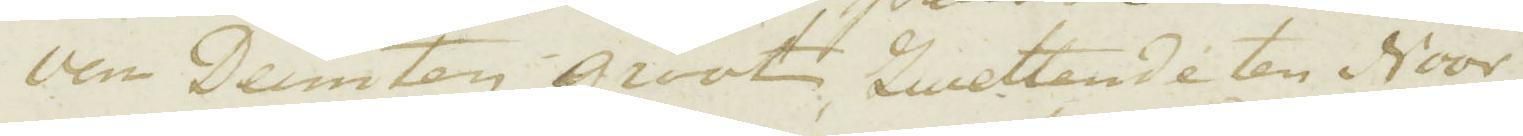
ven Deunten groot Zwettende ten Noor
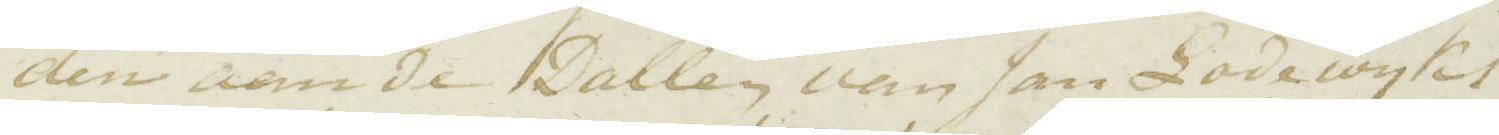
den aan de Dallen van Jan Lodewyks
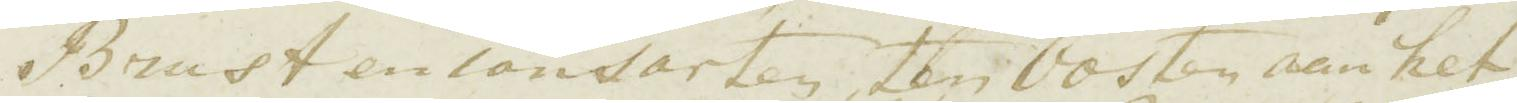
Brust en consorten, ten Oosten aan het
